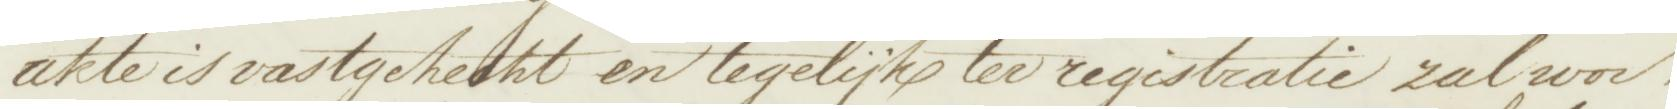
akte is vastgehecht en tegelijk ter registratie zal wor„
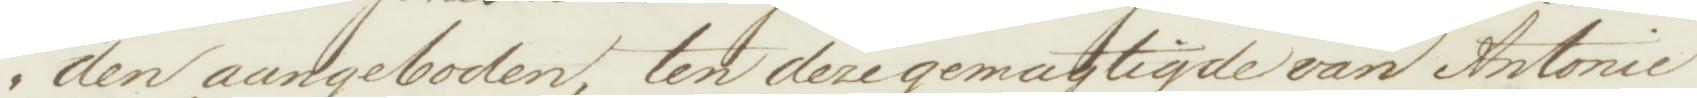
„ den aangeboden, ten deze gemagtigde van Antonie
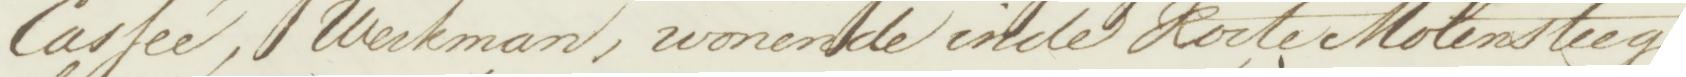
Casseé, Werkman, wonende inde Korte Molensteeg
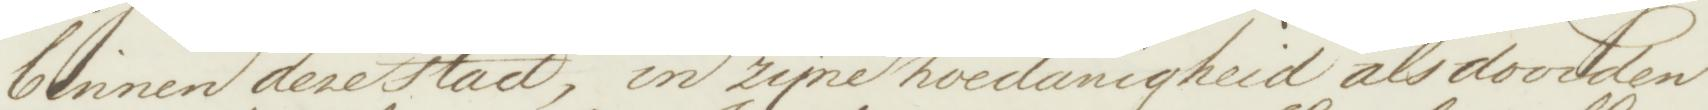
binnen deze stad, in zijne hoedanigheid als door den
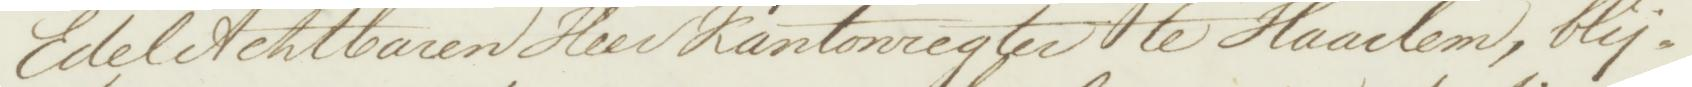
Edel Achtbaren Heer Kantonregter te Haarlem, blij„
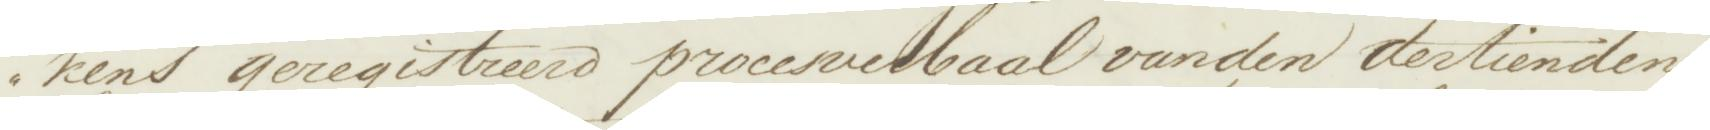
„ kens geregistreerd procesverbaal van den dertienden
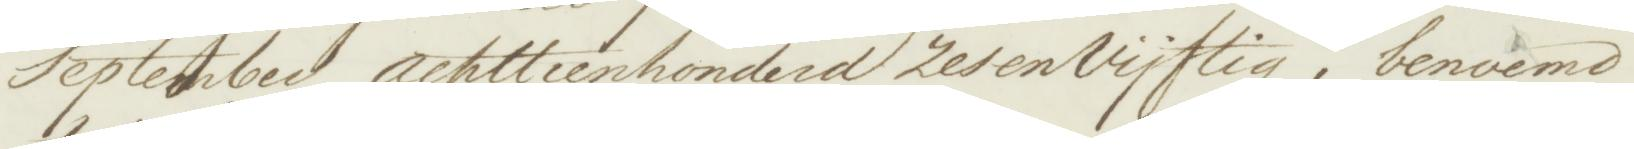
September achttienhonderd zesenvijftig, benoemd
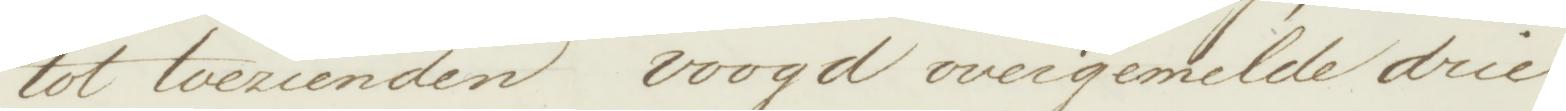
tot toezienden voogd overgemelde drie
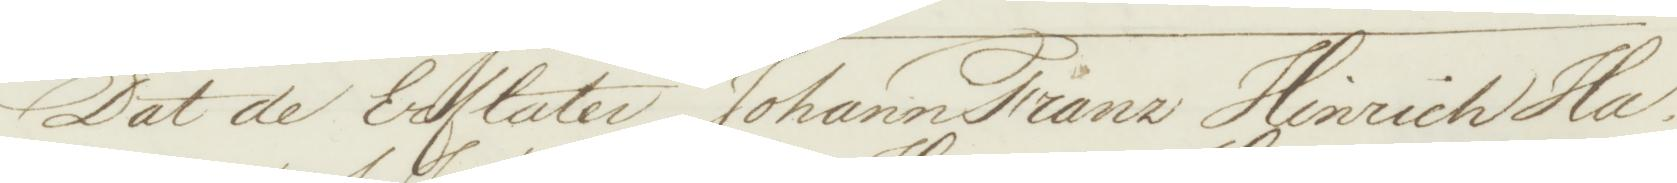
Dat de Erflater Johann Franz Hinrich Ha
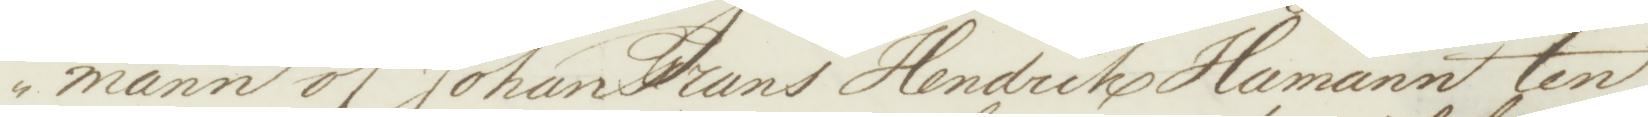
„mann of Johan Frans Hendrik Hamann ten
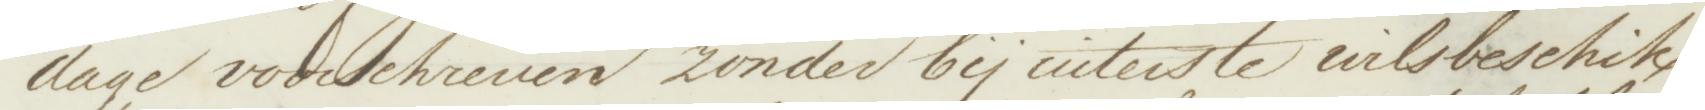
dage voorschreven zonder bij uiterste wilsbeschik
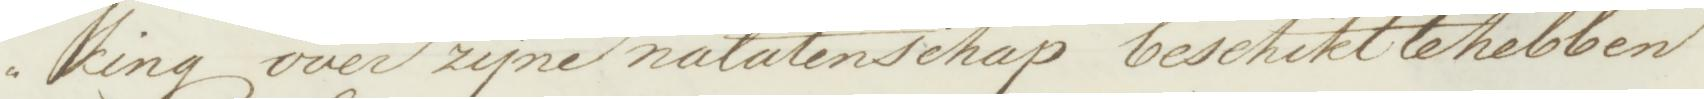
„king over zijne nalatenschap beschikt te hebben
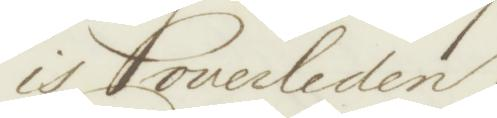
is overleden.
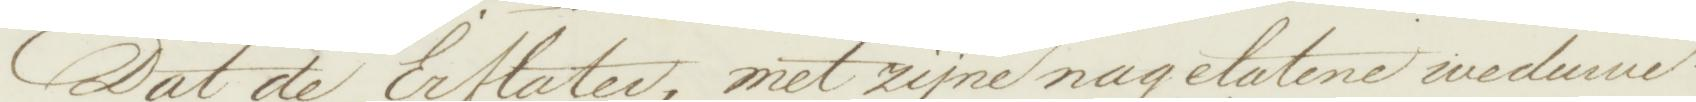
Dat de Erflater, met zijne nagelatene weduwe
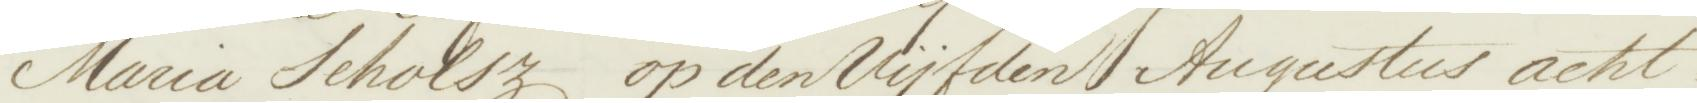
Maria Scholsz op den Vijfden Augustus acht
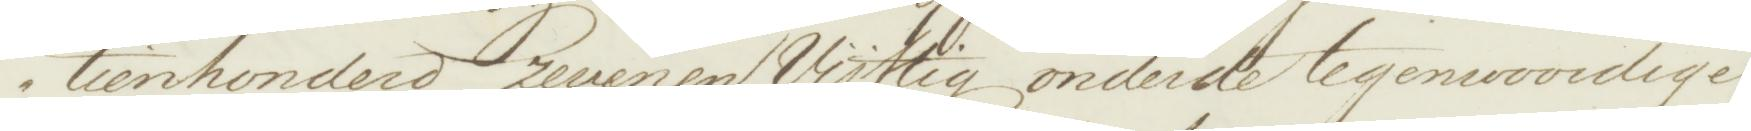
„tienhonderd zevenen Vijftig onder de tegenwoordige
